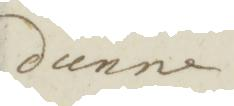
dunne
